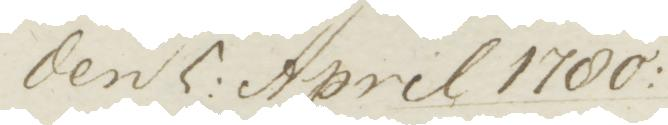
den 5: April 1780:
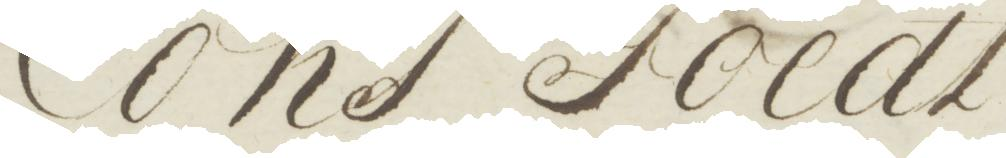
Coks Goedt
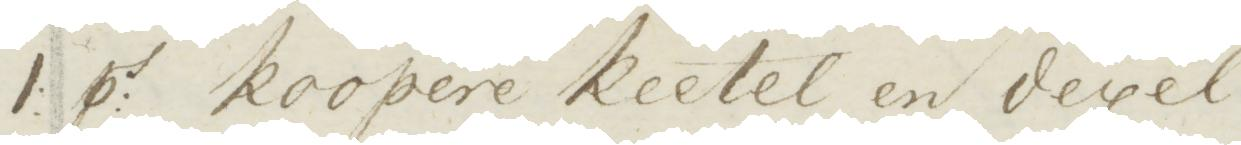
1: p:s koopere keetel en dexel
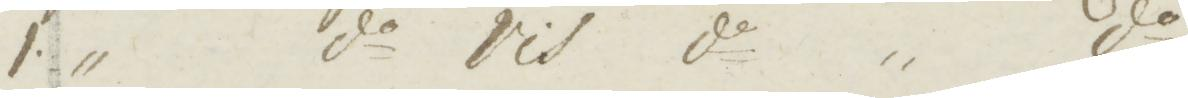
1:„ d=o Vis d=o „ d=o
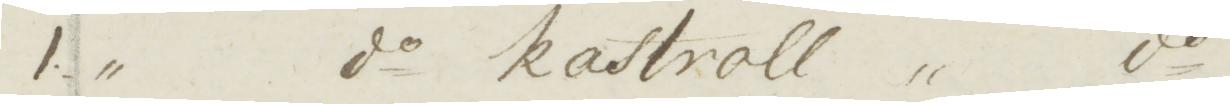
1:„ d=o kastroll „ d=o
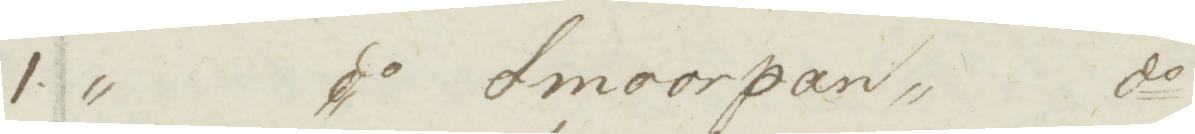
1. „d=o smoorpan „ d=o
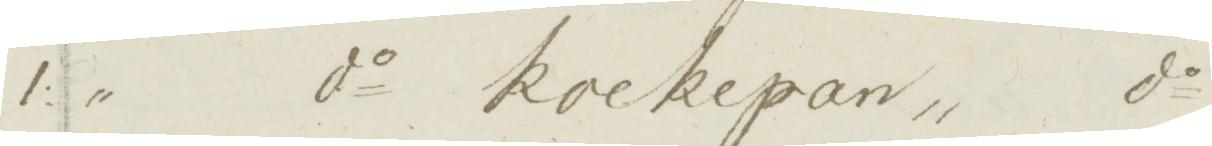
1:„ d=o koekepan„ d=o
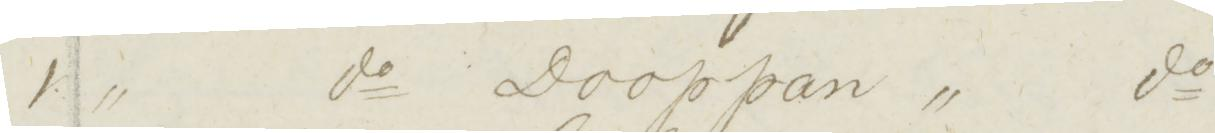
1:„ d=o Dooppan „ d=o
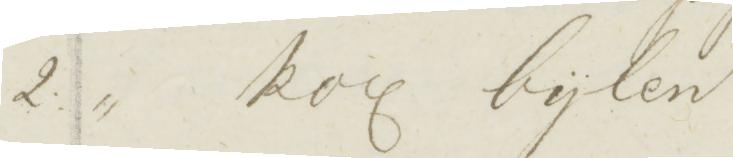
2:„ kox bijlen
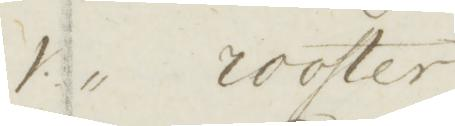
1:„ rooster
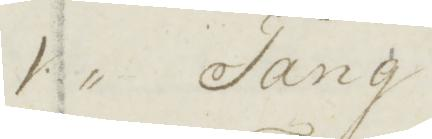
1:„ Tang
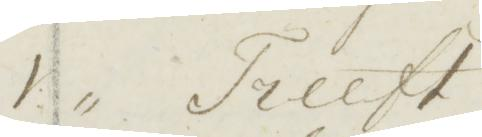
1:„ Treeft
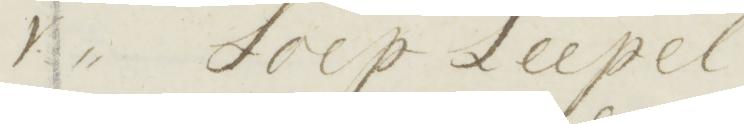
1:„ Soep Leepel
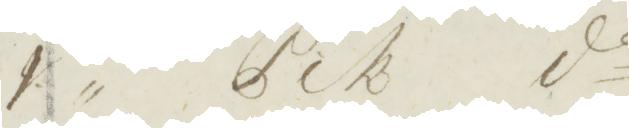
1:„ Pik d=o
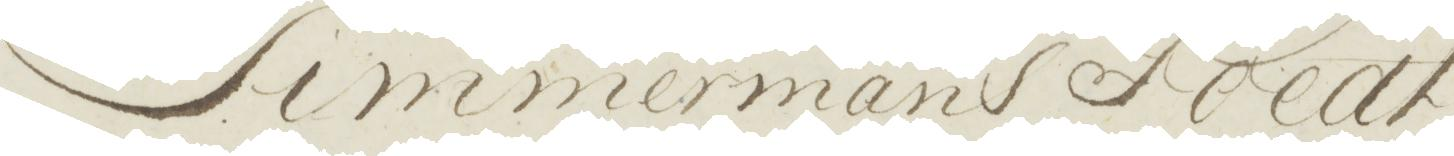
Timmermans Goedt
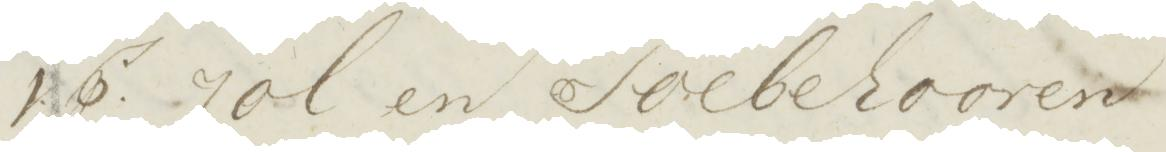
1: p.s Jol en Toebehooren
